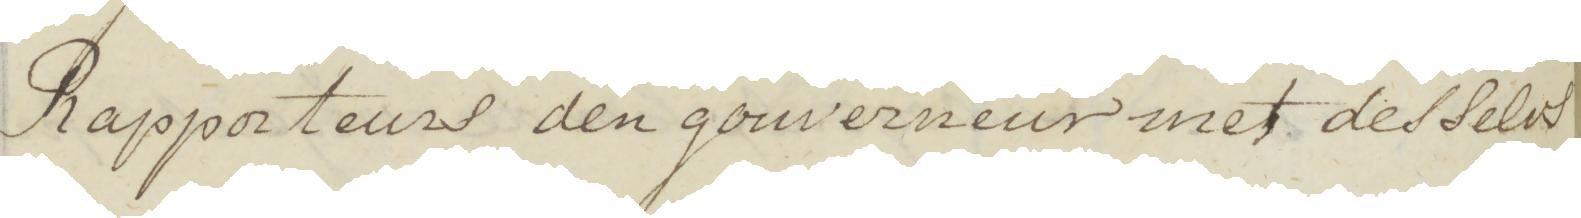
Rapporteurs den gouverneur met desselvs
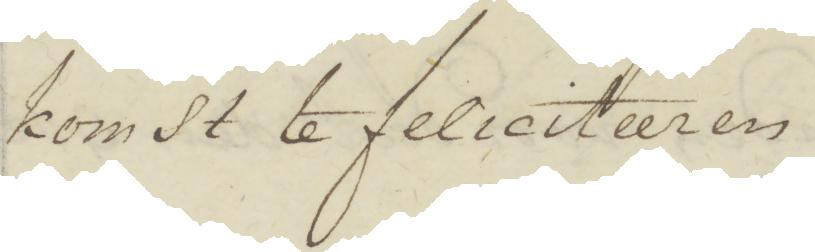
komst te feliciteeren
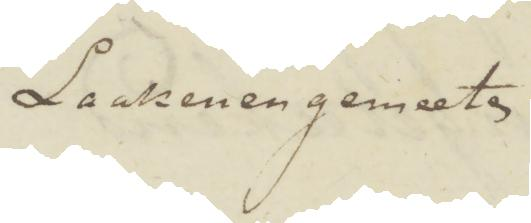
Laakenen gemeeten
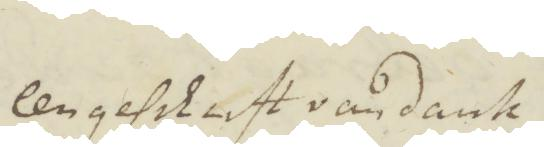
een geschrift van dank
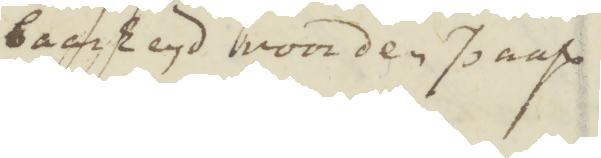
baarheyd voor den paap
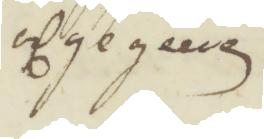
overgegeeven
